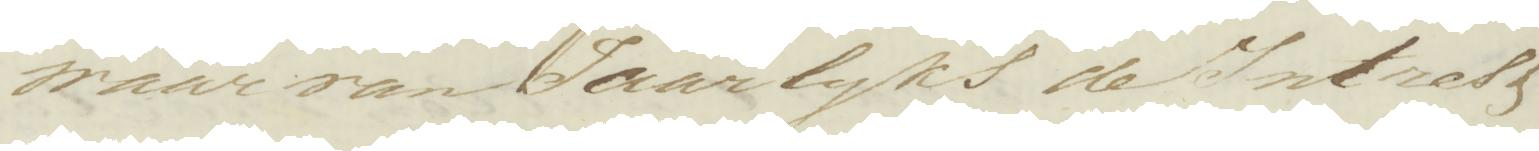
waar van Jaarlijks de Intrest
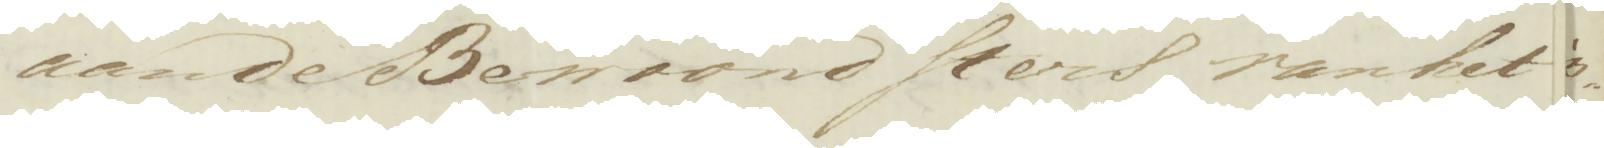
aan de Bewoondsters van het
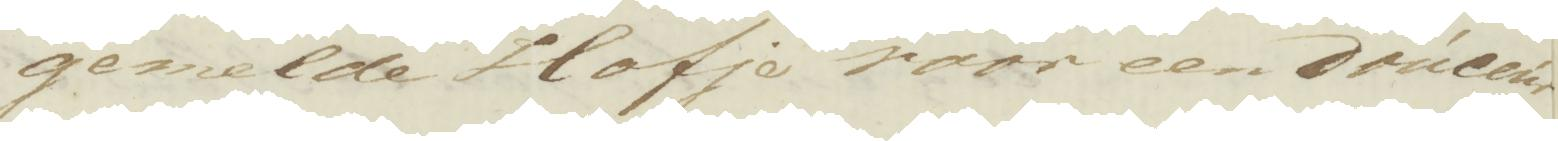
gemelde Hofje voor een douceur
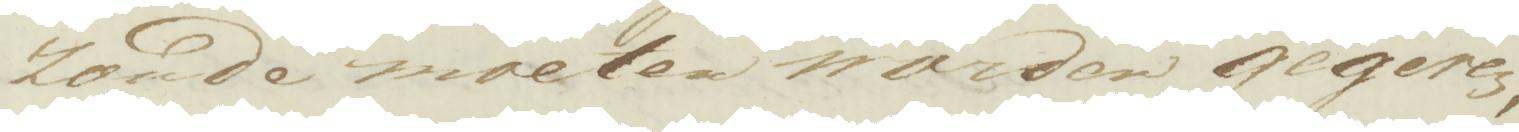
zoude moeten worden gegeven,
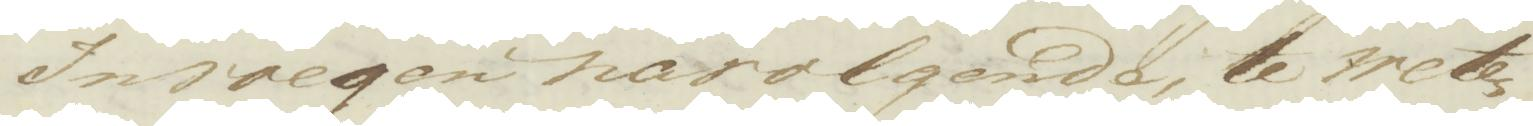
Invoegen navolgende, te weten
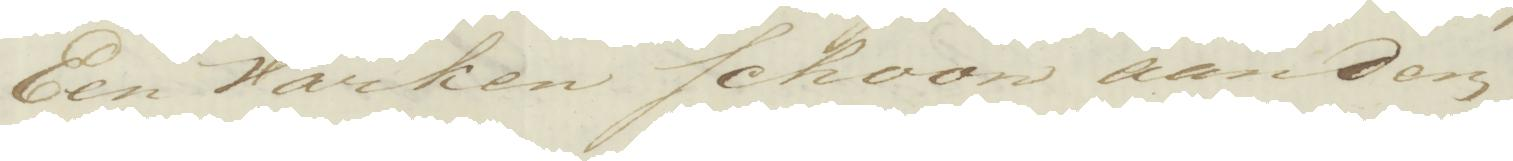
Een Varken schoon aan den
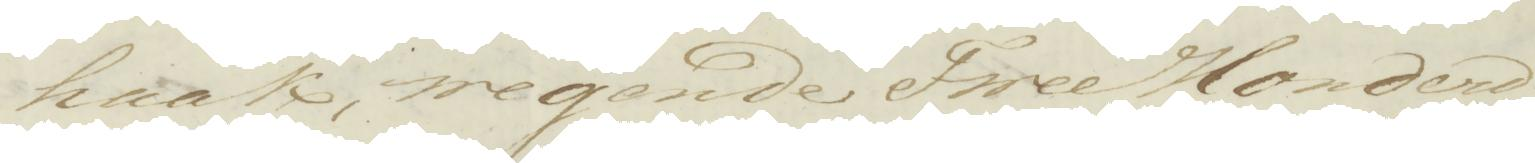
haak, wegende Twee Honderd
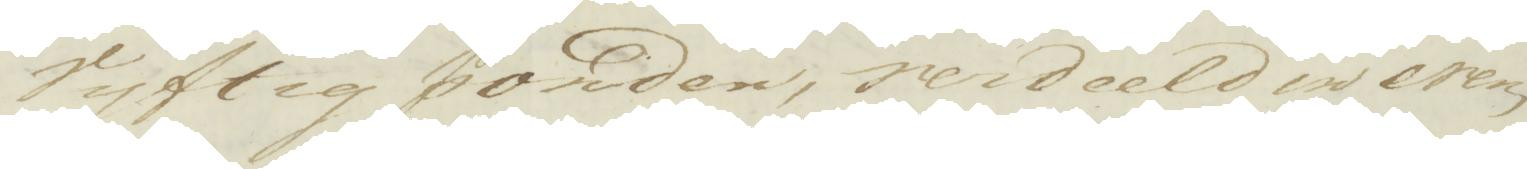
Vijftig ponden, verdeeld in even
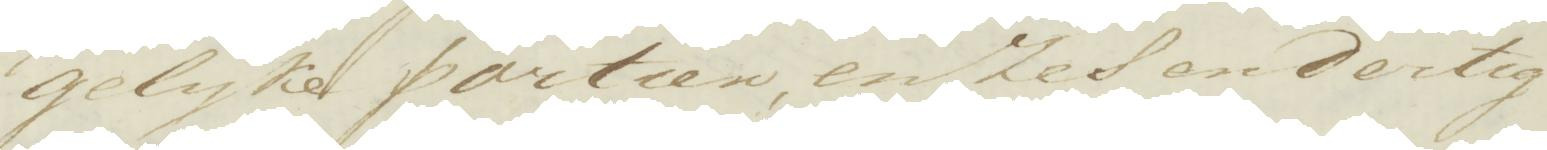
gelijke portien, en Zes en dertig
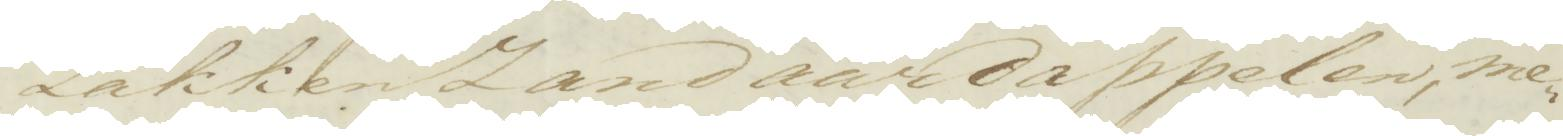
Zakken Zandaardappelen, me„
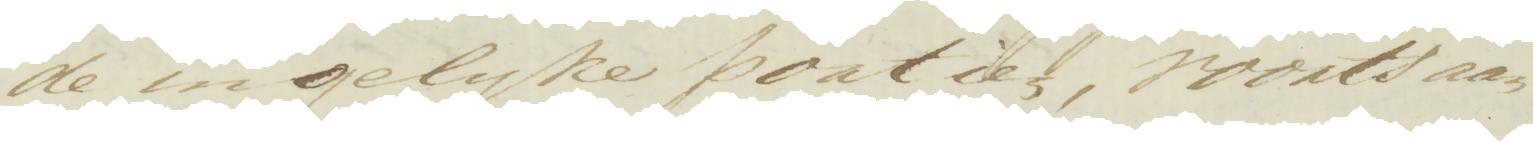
de in gelijke portien, voorts aan
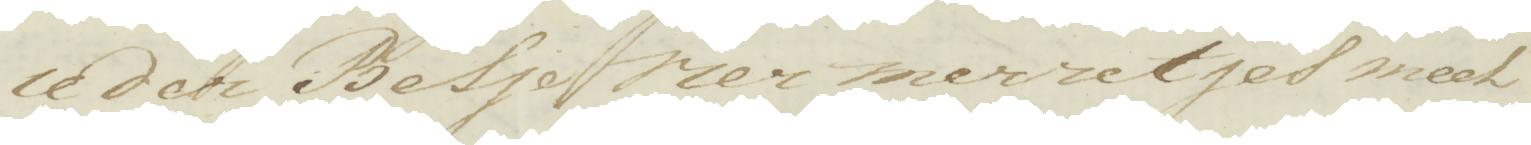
ieder Besje vier merretjes meel
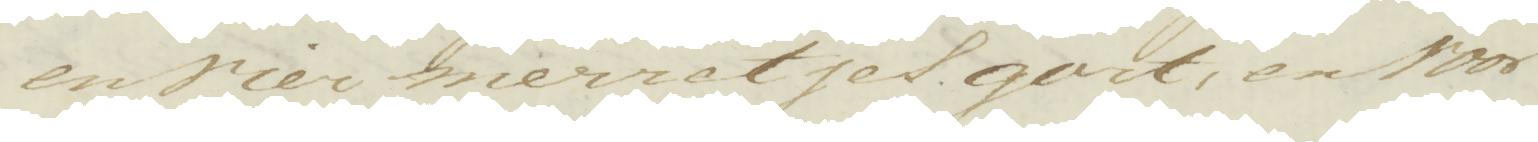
en vier merretjes gort, en voor
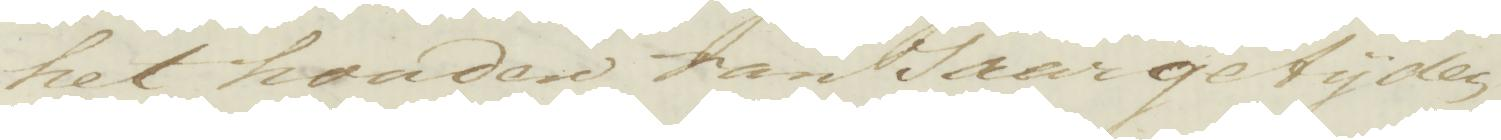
het houden van Jaargetijden
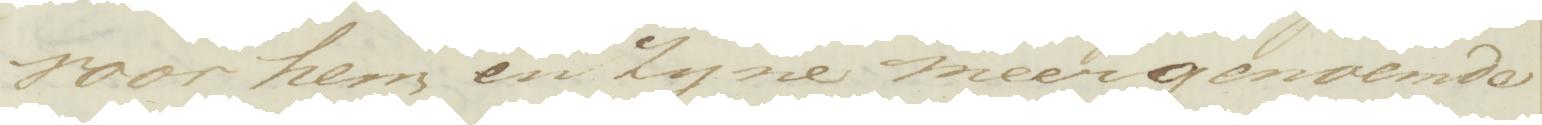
voor hem en Zijne meer genoemde
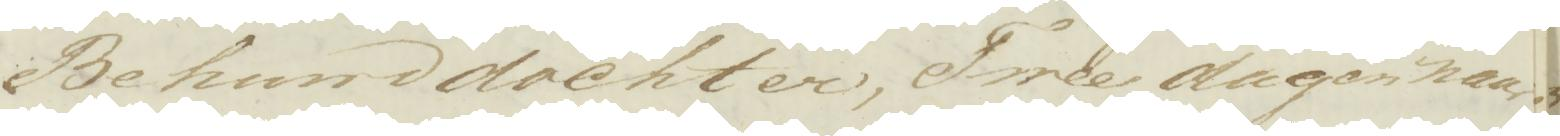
Behuwddochter, Twee dagen naa
